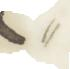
5„
